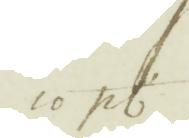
10 pt.
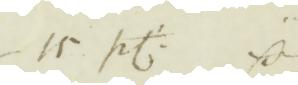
15 pt.
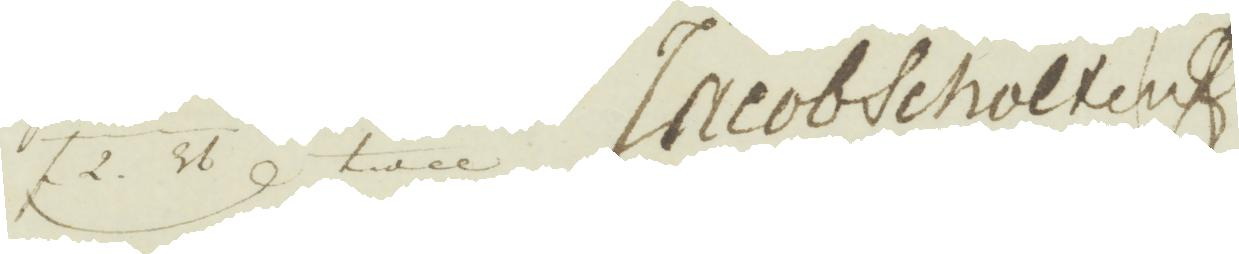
ƒ 2.36d twee Jacob Scholten
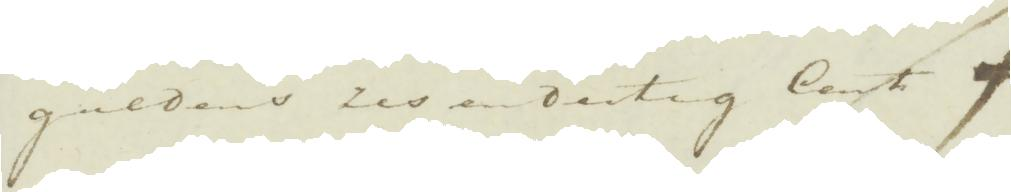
guldens zes dertig Cent
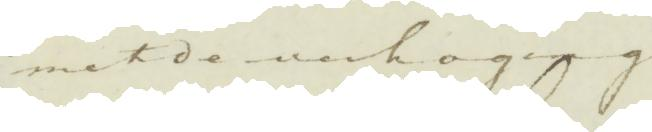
met de verhoginge
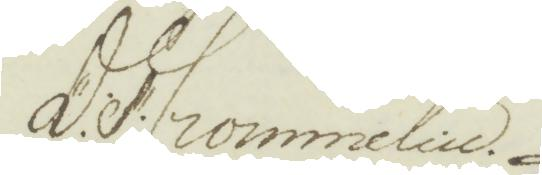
D:IJ: Crommelin.
